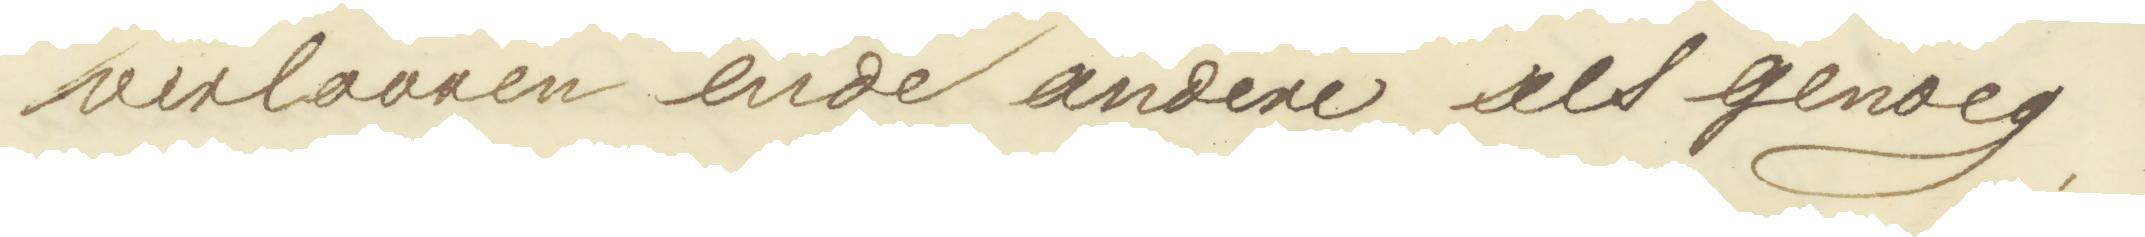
verlooren ende andere als genoeg„
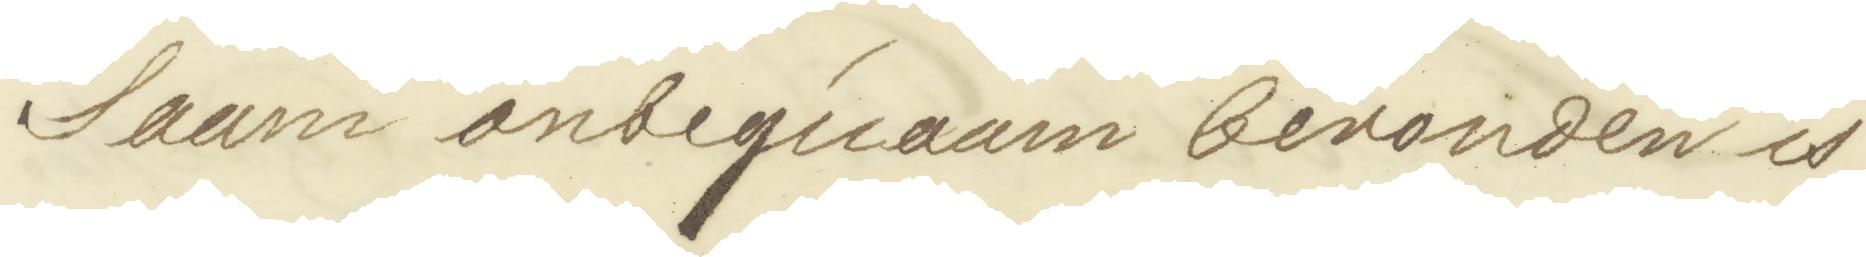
saam onbequaam bevonden is,
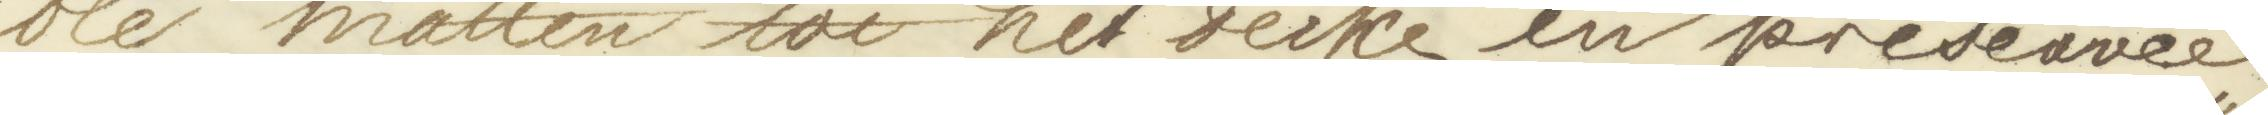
ole matten tot het decken en preservee„
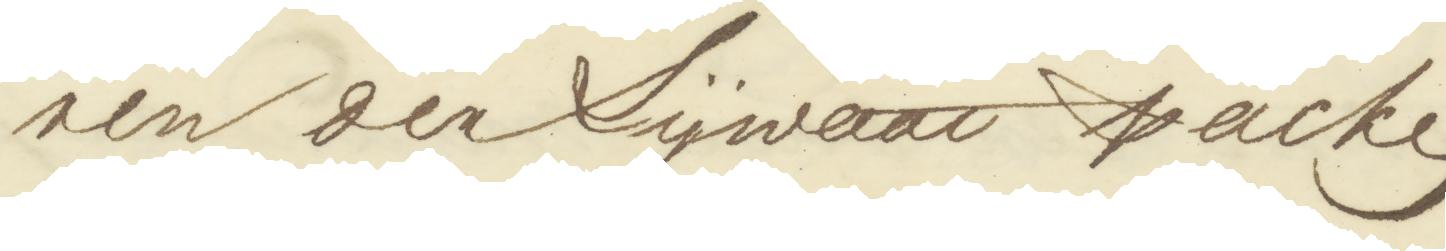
ren der Lijwaat packen
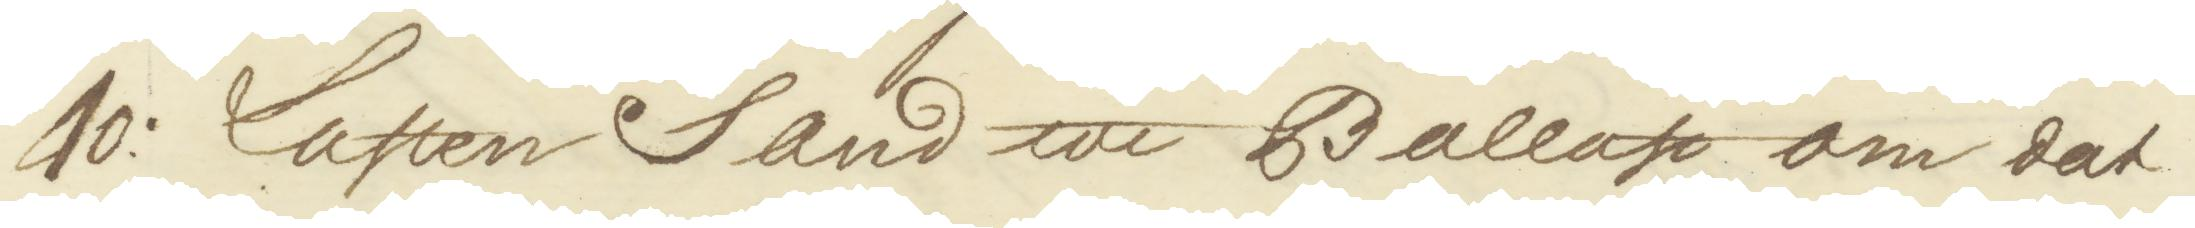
40: Lasten Sand tot Ballast om dat
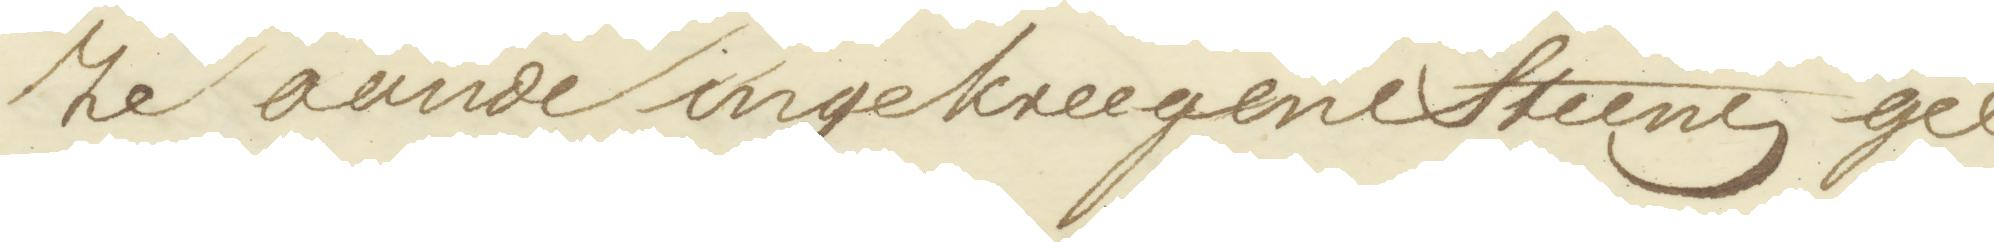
ze aande ingekreegene steenen geen
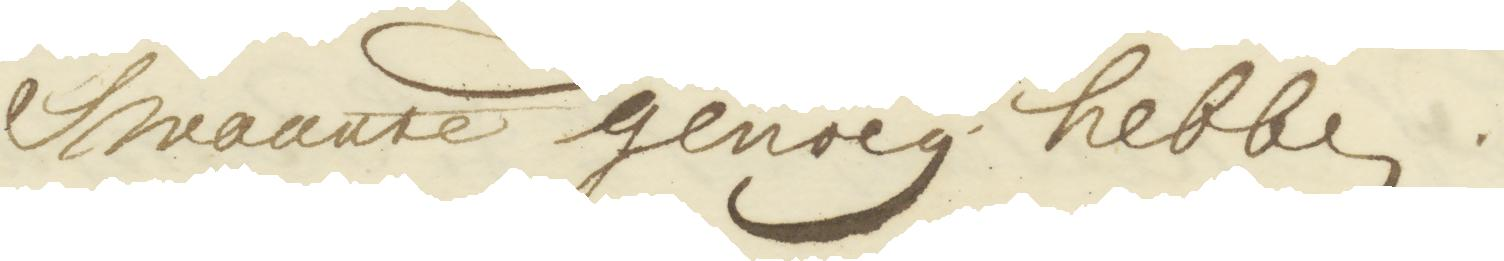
swaarte genoeg hebben.
